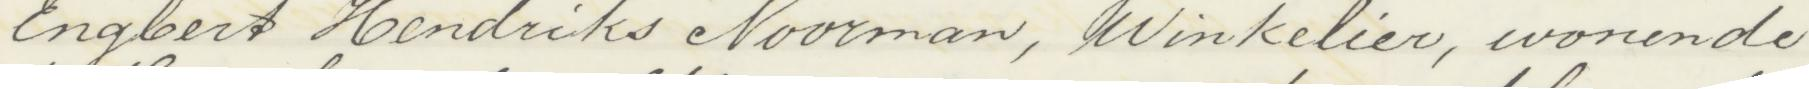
Engbert Hendriks Noorman, Winkelier, wonende
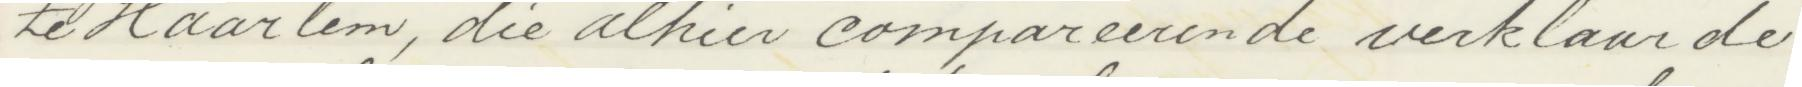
te Haarlem, die alhier compareerende verklaarde
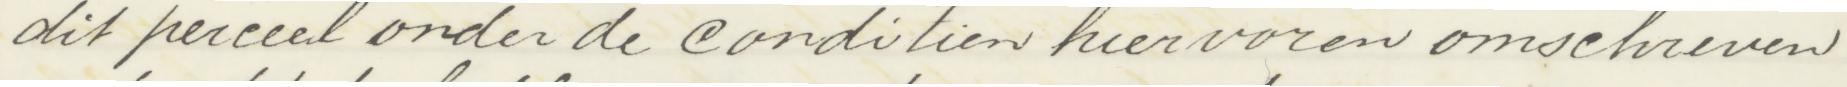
dit perceel order de conditien hier voren omschreven
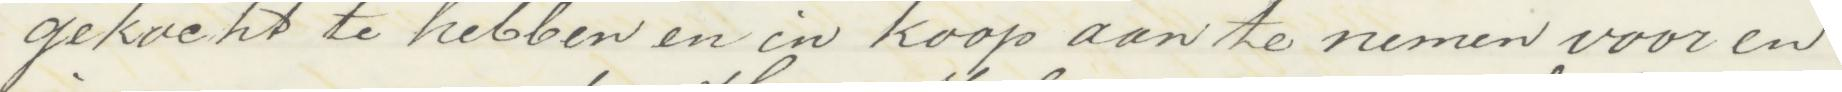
gekocht te hebben en in koop aan te nemen voor en
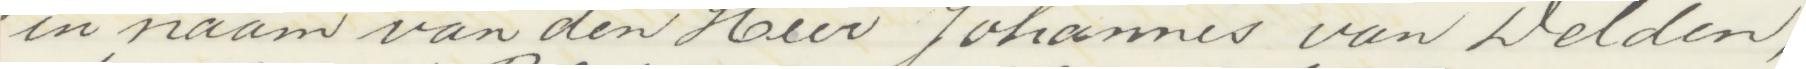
in naam van den Heer Johannes van Delden,
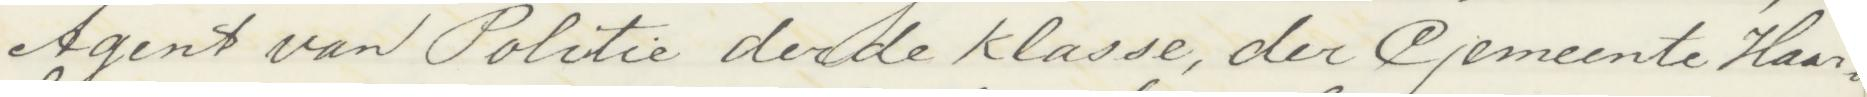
Agent van Politie derde klasse, der Gemeente Haar=
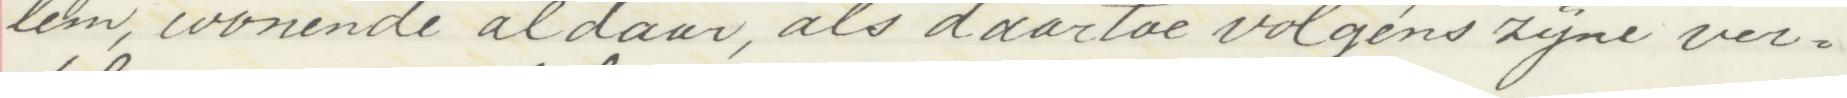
lem, wonende aldaar, als daartoe volgens zijne ver=
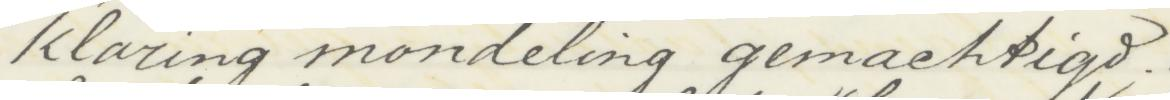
klaring mondeling gemachtigd.
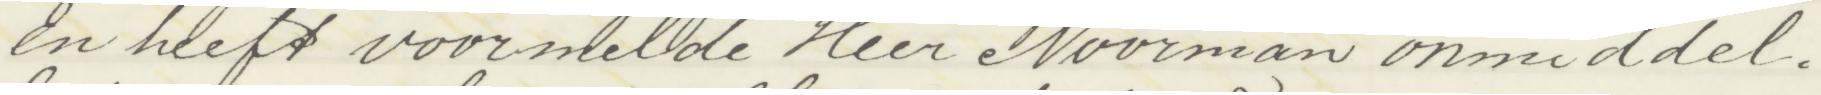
En heeft voormelde Heer Noorman onmiddel=
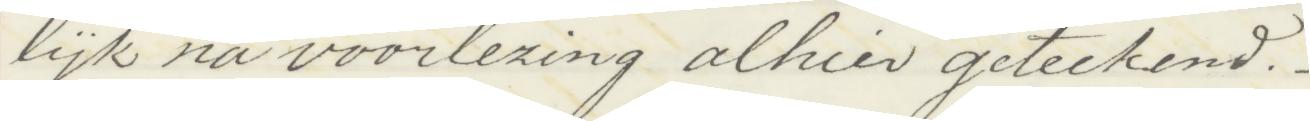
lijk na voorlezing alhier geteekend.
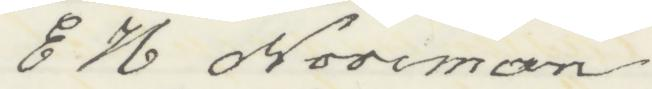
E H Noorman
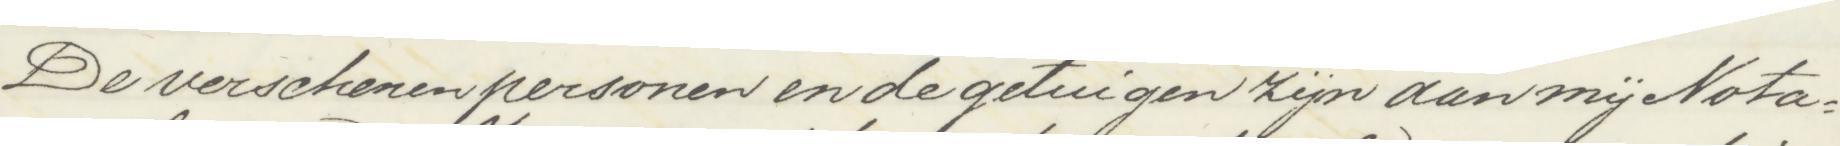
De verschenen personen en de getuigen zijn dan mij Nota=
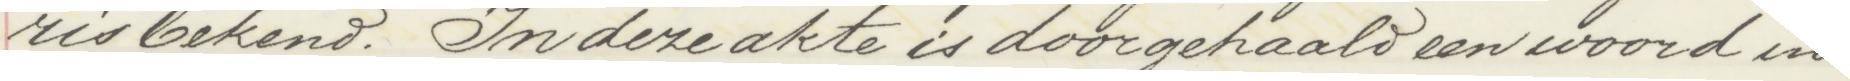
ris bekend. In deze akte is doorgehaald een woord in
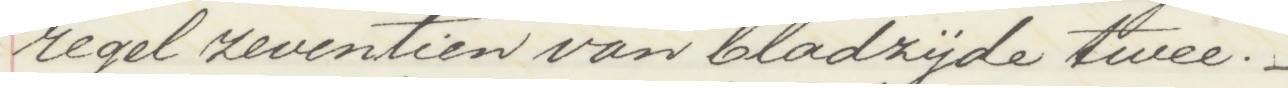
regel zeventien van bladzijde twee.
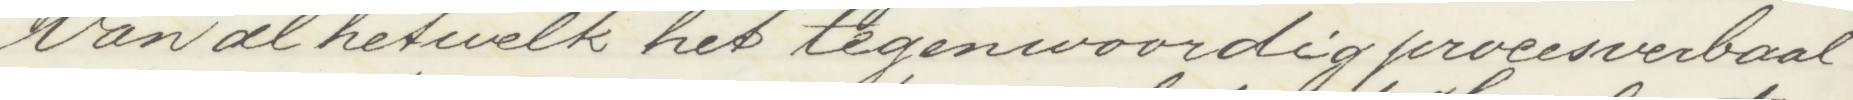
van al hetwelk het tegenwoordig procesverbaal
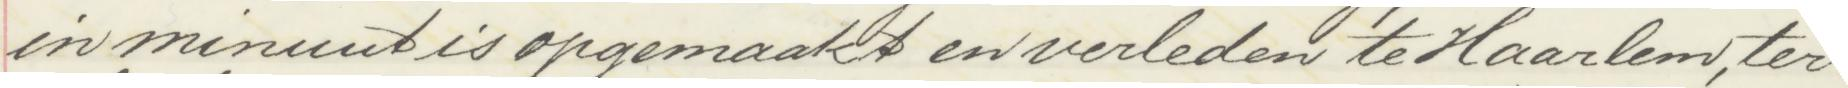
in minuut is opgemaakt en verleden te Haarlem ter
